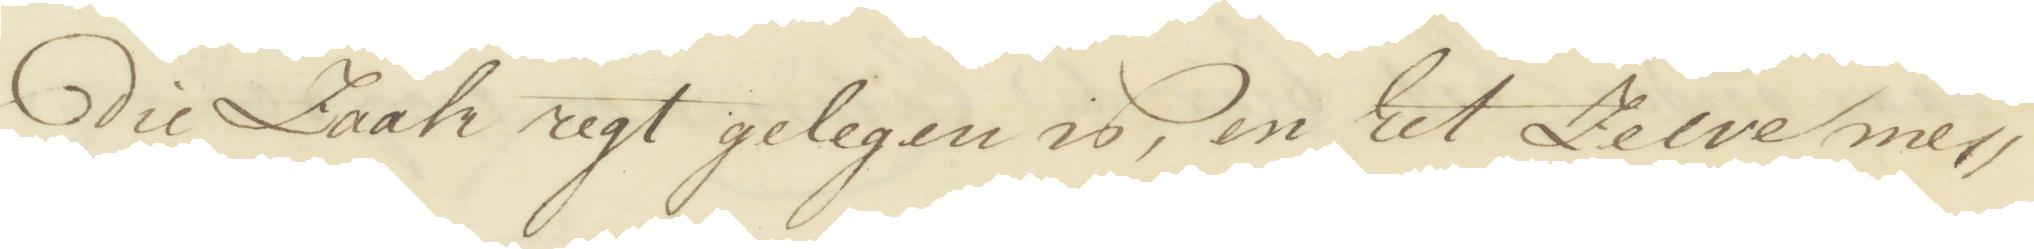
die zaak regt gelegen is, en het zelve me„
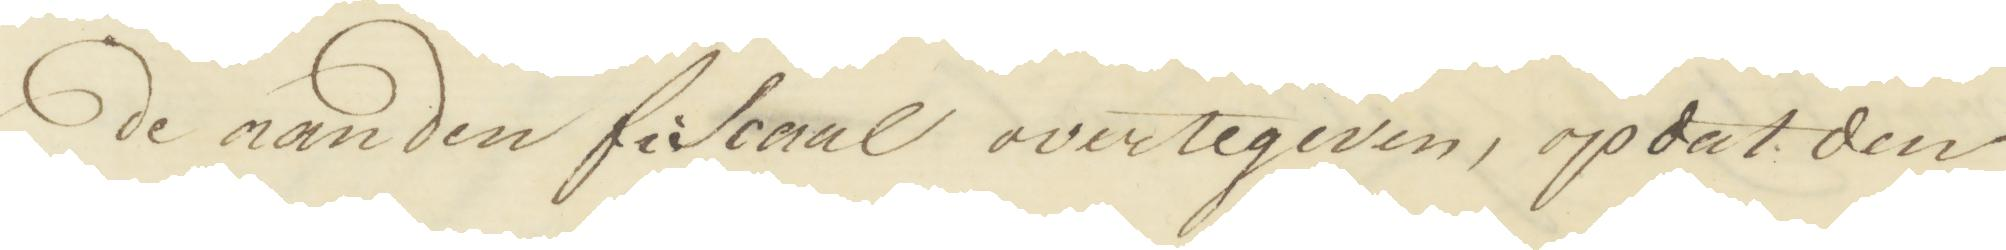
de aan den fiscaal overtegeven, op dat den
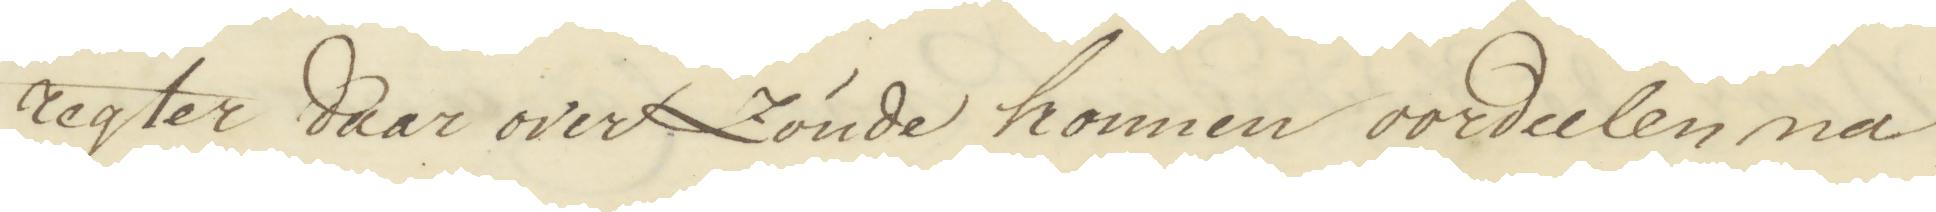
regter daar over zoude konnen oordeelen na
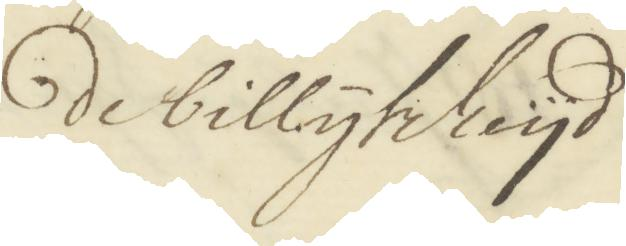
de billijkheijd
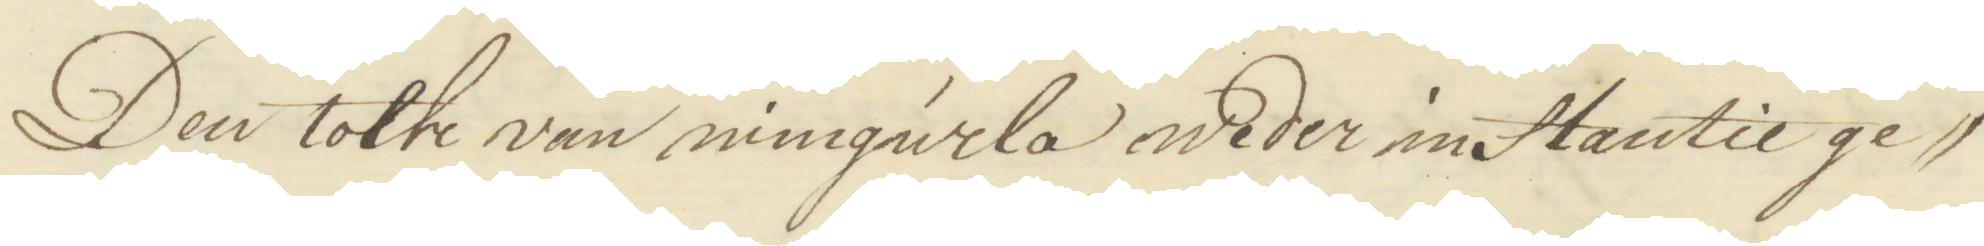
Den tolk van nimgurla weder instantie ge„
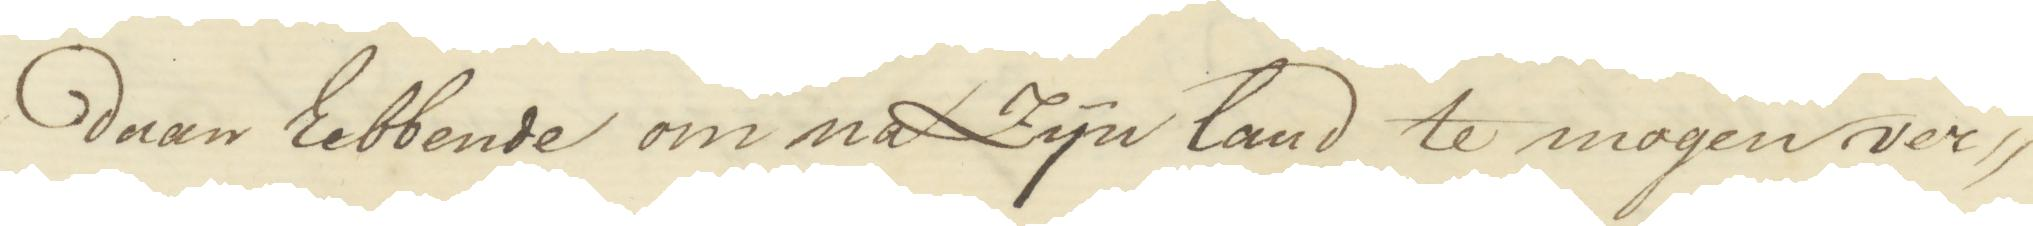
daan hebbende om na zijn land te mogen ver„
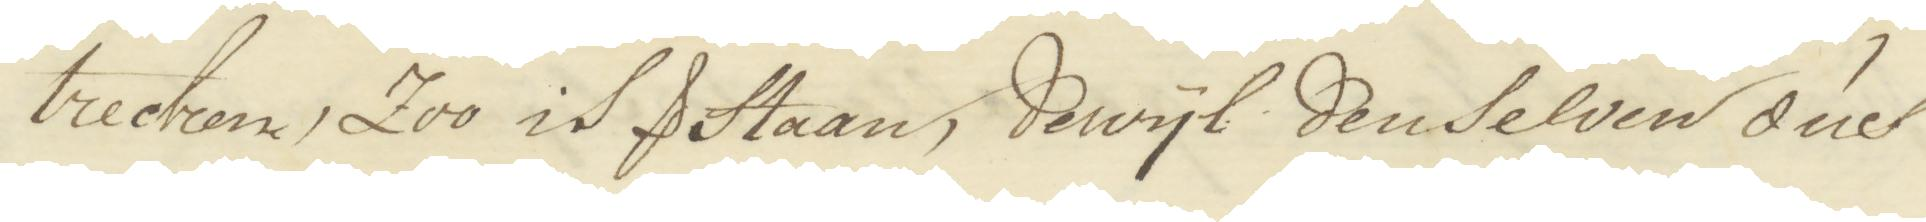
trecken, zoo is verstaan, dewijl denselven dus
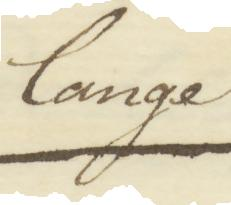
lange
